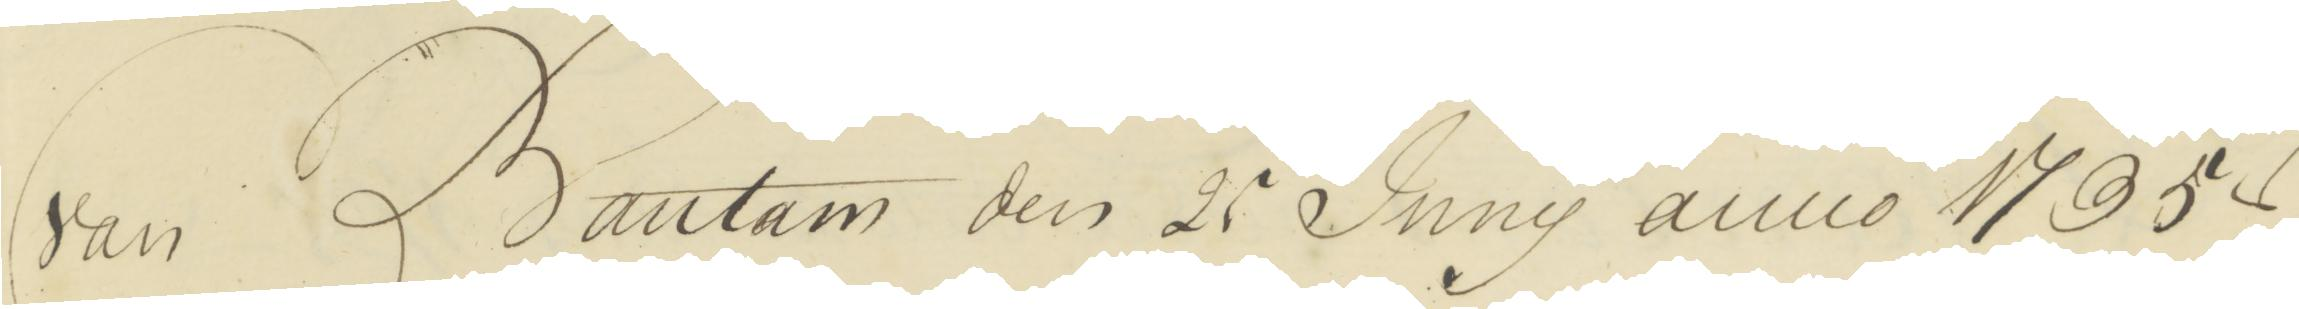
Van Bantam den 25 Junij anno 1735.
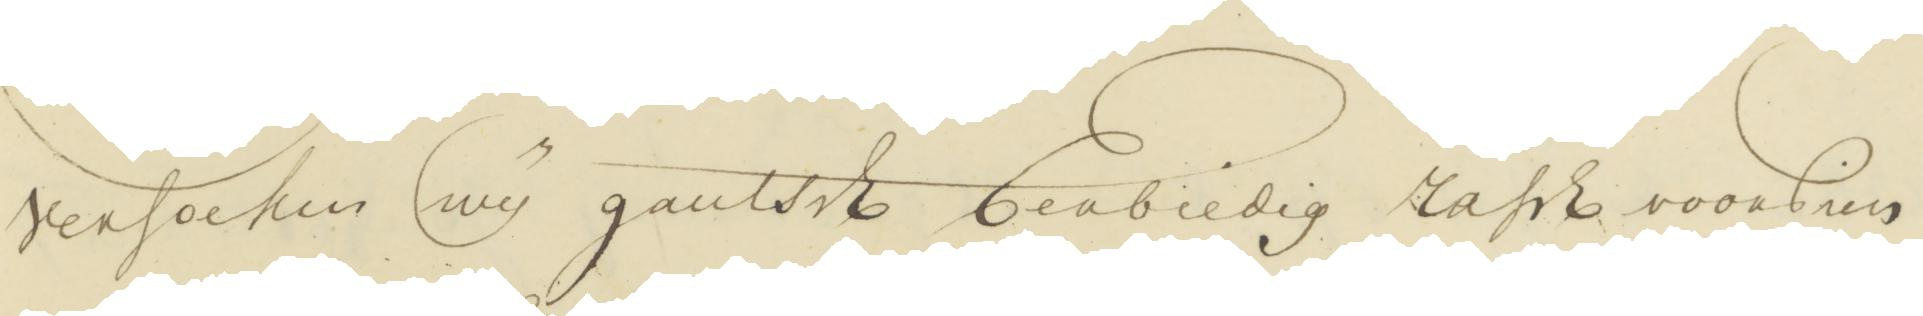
versoeken wij gantsch Eerbiedig rasch voorsien
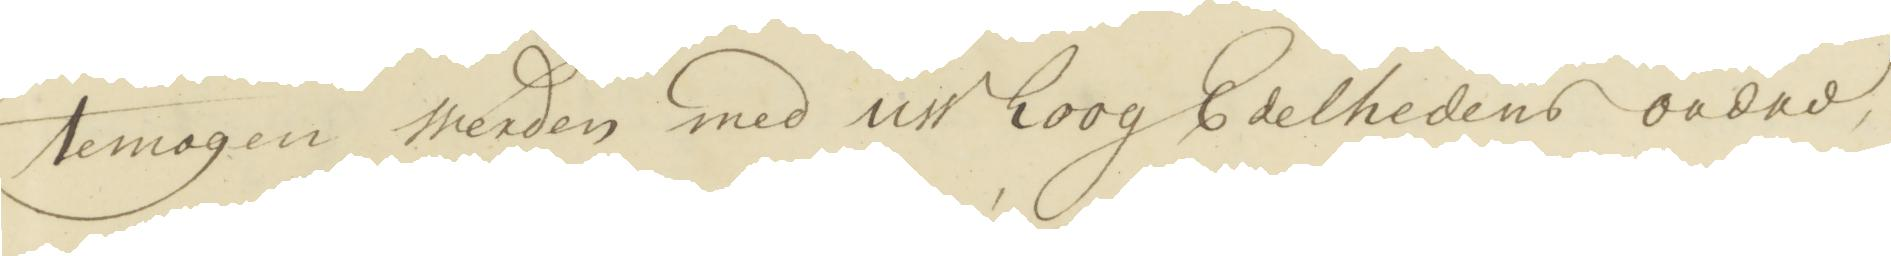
temogen werden med uw hoog Edelhedens ordre,
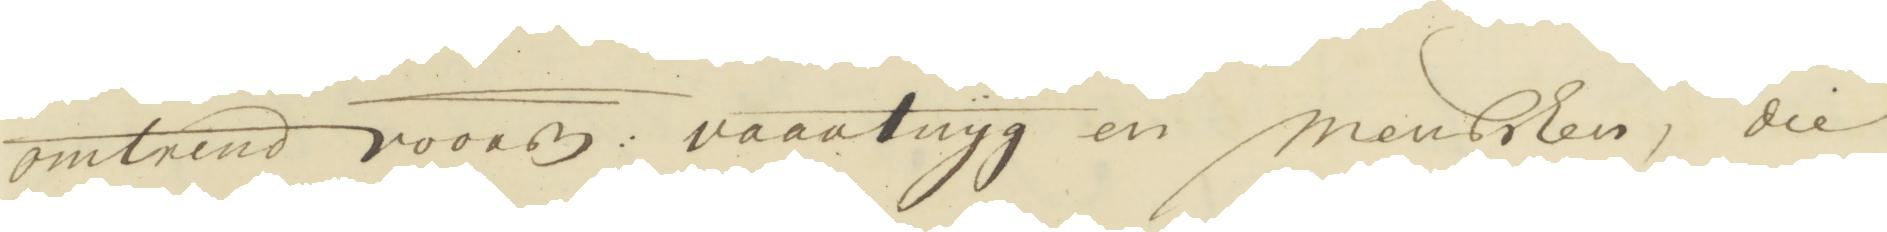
omtrend voorsz: vaartuijg en menschen, die
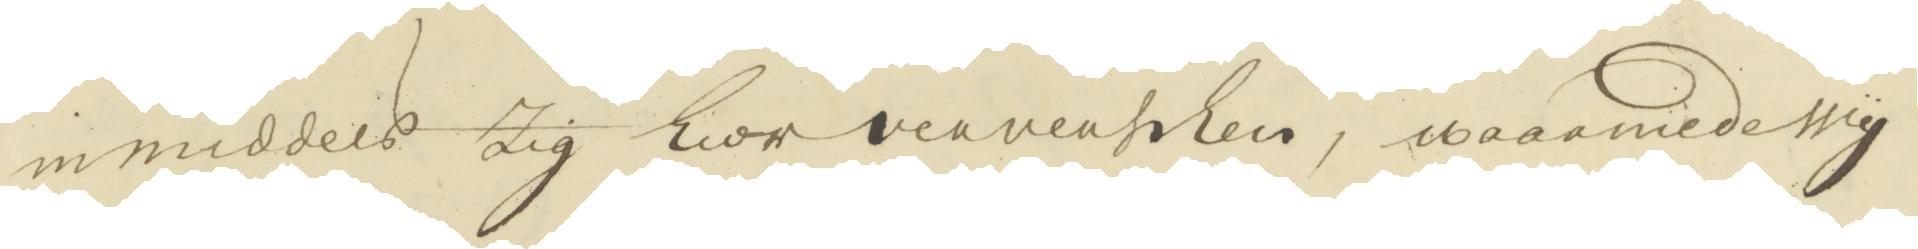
inmiddels Zig hier ververschen, waarmede wij
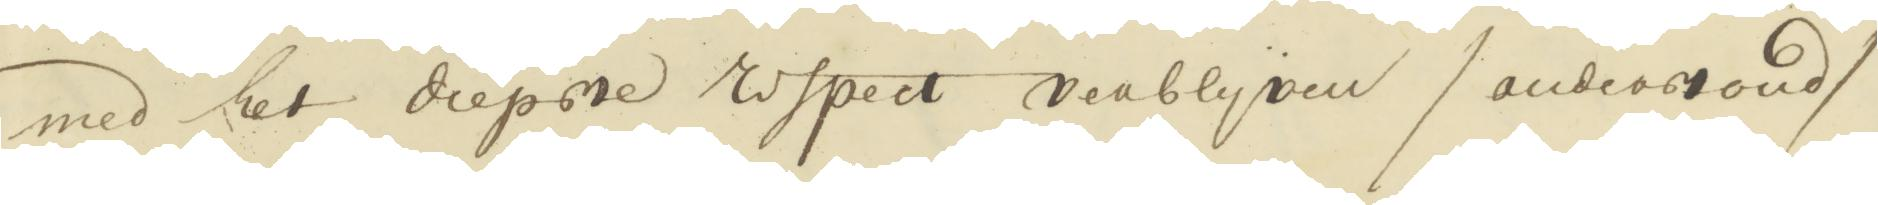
med het diepste respect verblijven / onderstond/
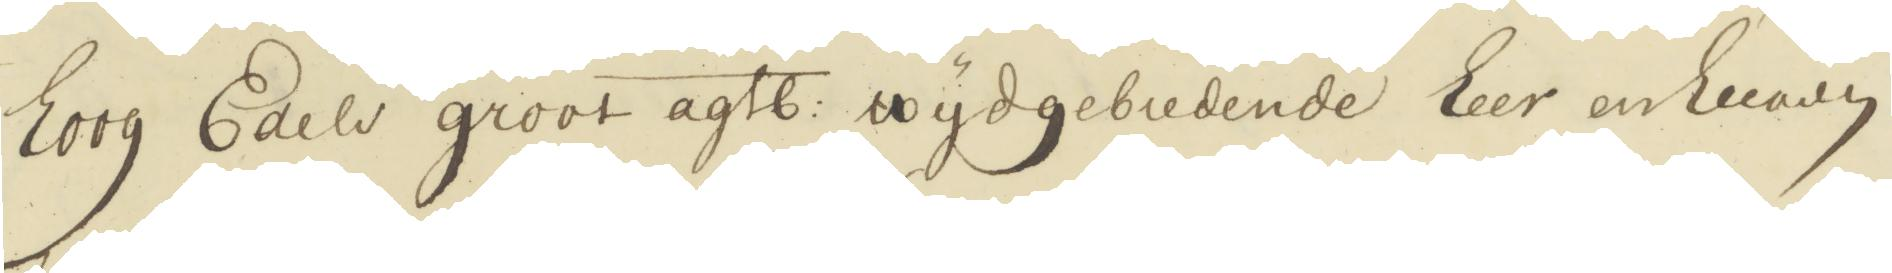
hoog Edele groot agtb: wijdgebiedende heer en heeren
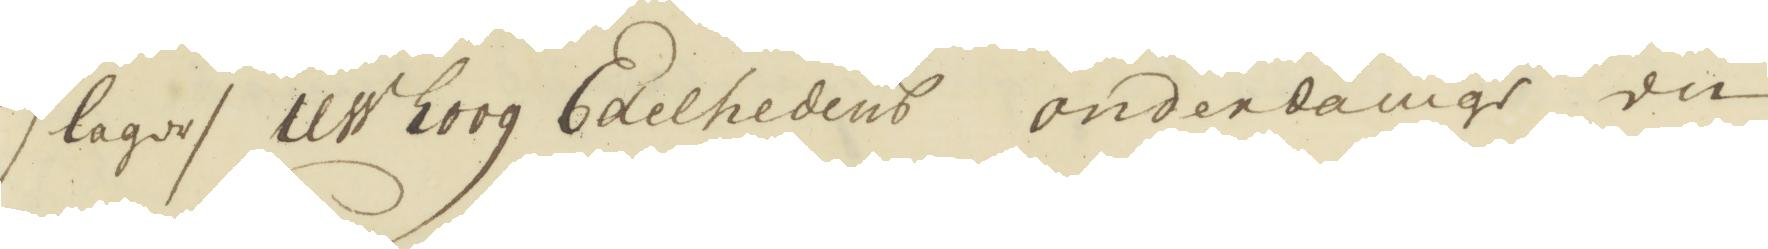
/ lager/ UW hoog Edelhedens onderdanigs en
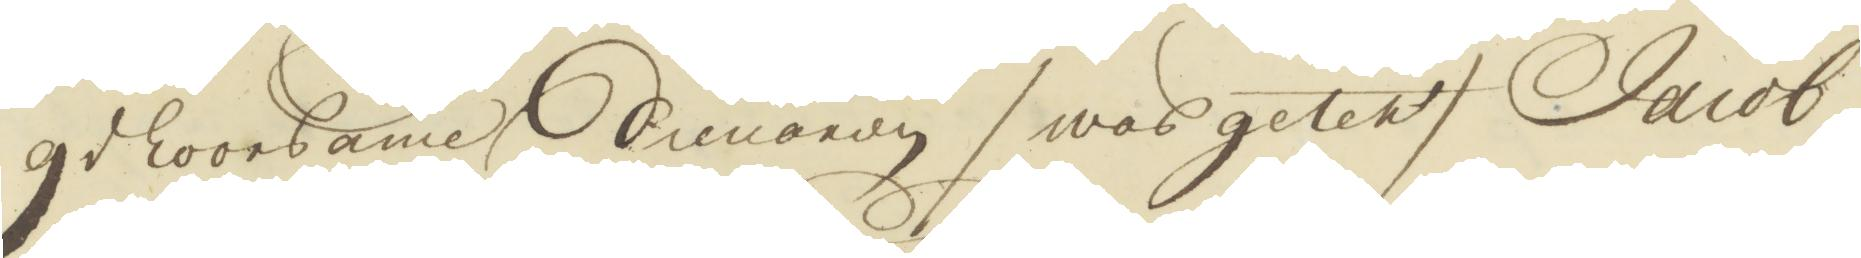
gehoorsame dienaren / was getek:t / Jacob
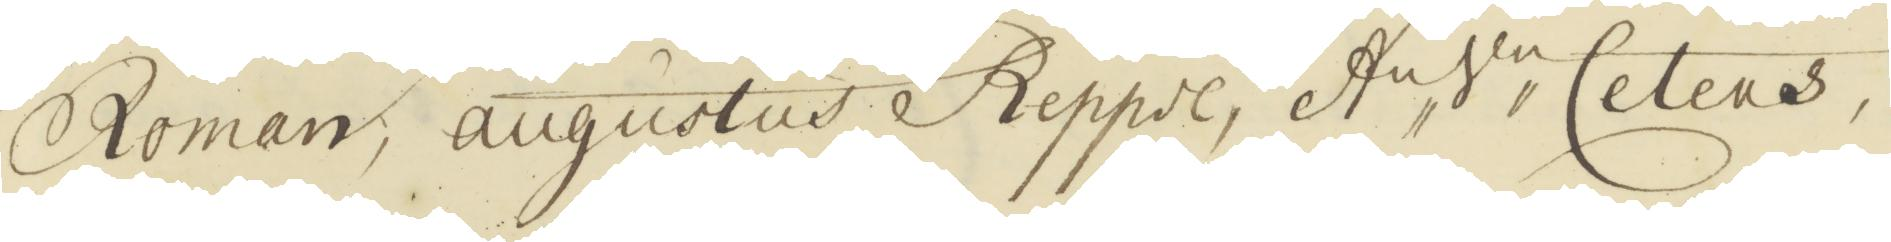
Roman; augustus Reppel, A„n V„n Ceters,
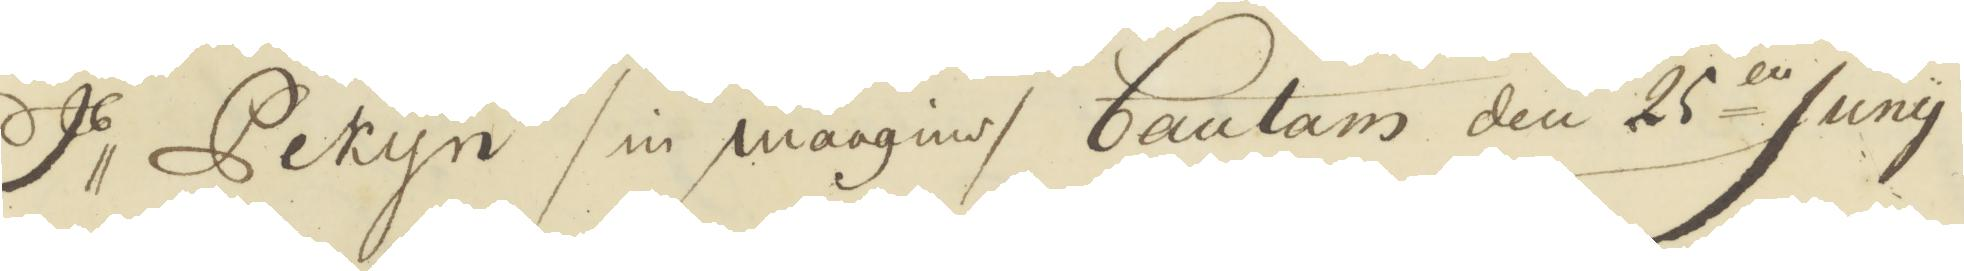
J„b Pekijn / in margine/ bantam den 25=en Junij
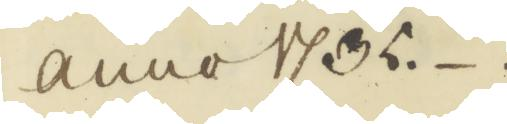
anno 1735. —
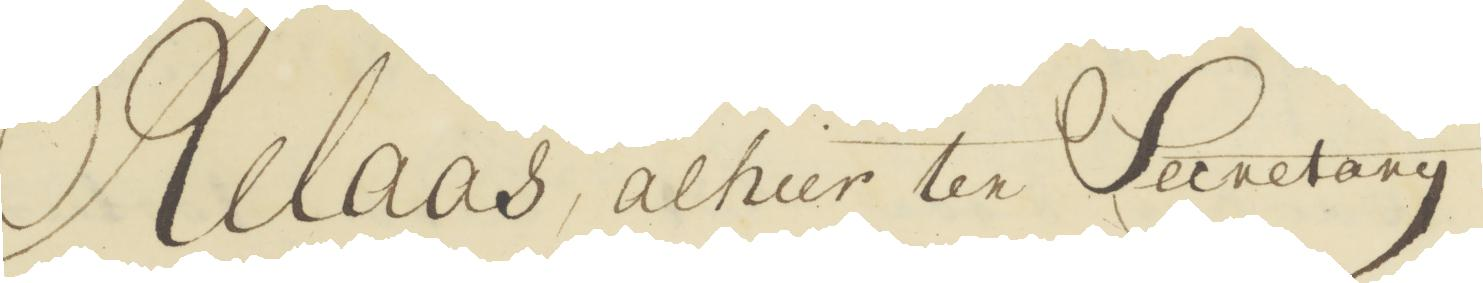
Relaas, alhier ter Secretarij
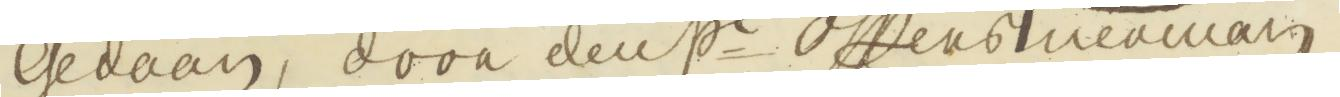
gedaan, door den p=l opperstuerman
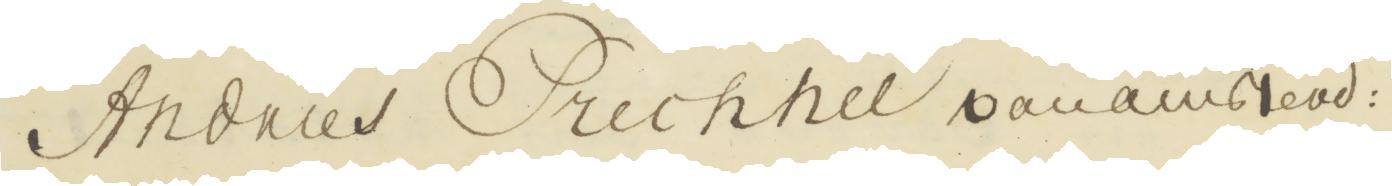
Andries Prechhel van amsterd:m
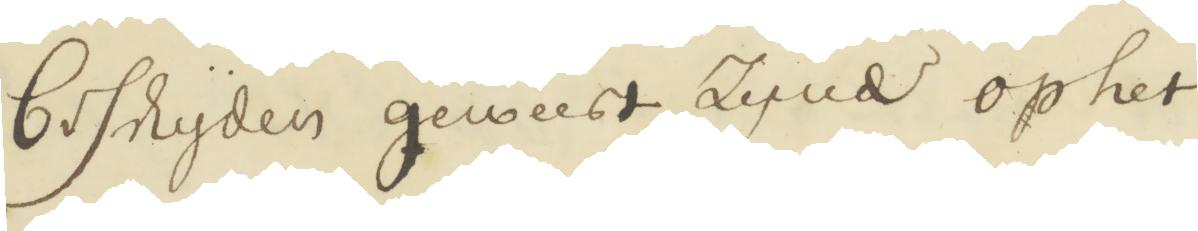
beschijden geweest Zijnde op het
